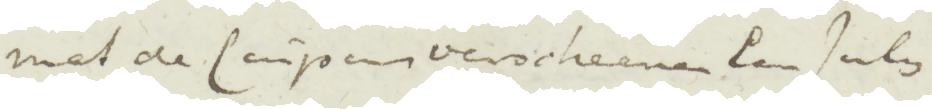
met de Coupons verscheenen Een July
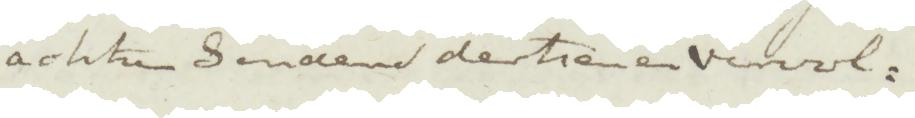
achtien honderd dertien en vervol=
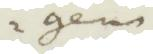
=gens
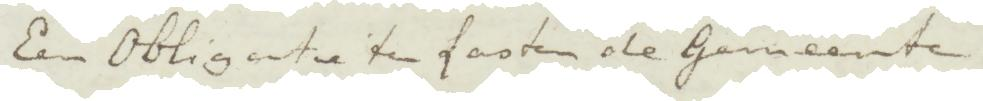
Een Obligatie ten Lasten de Gemeente
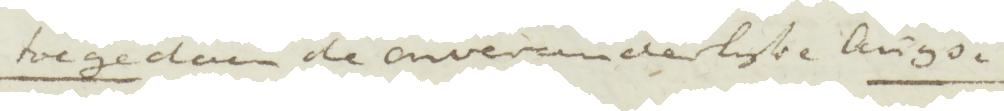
toegedaan de onveranderlijke Augs„
